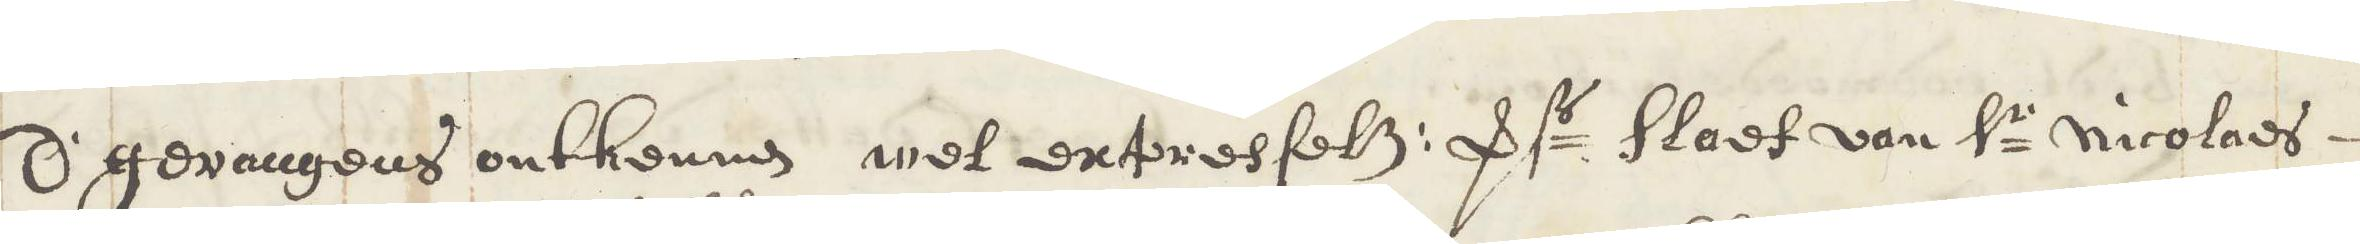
d’ gevangens ontkennen wel expresselijk: vers=z slaef van h=r nicolaes -
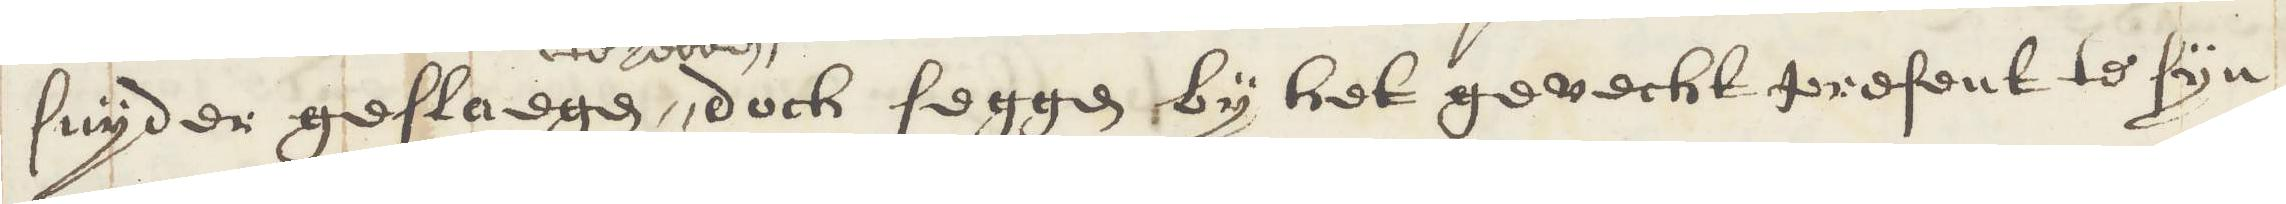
snijder geslaegen „ te hebben, doch seggen bij het gevecht present te sijn
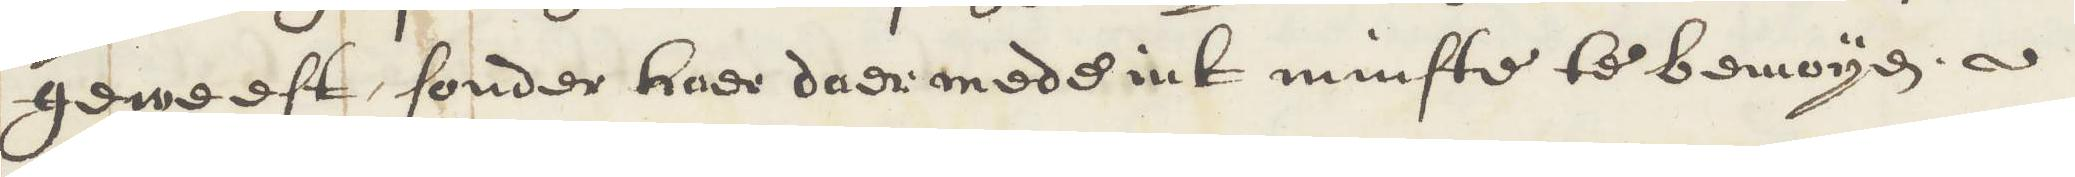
geweest, sonder haer daer mede in't minste te bemoijen.
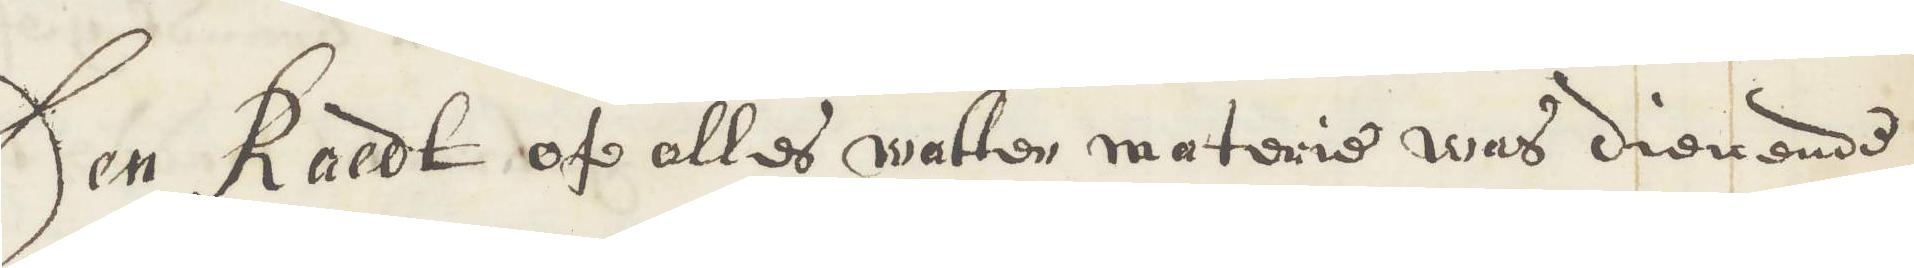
Den Raedt op alles watter materie was dienende
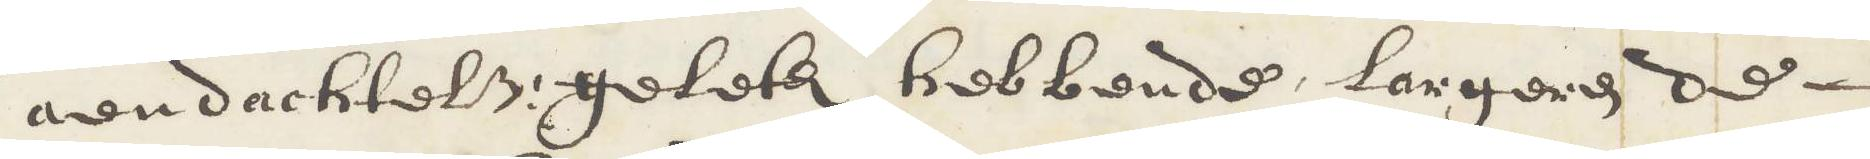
aendachtelijk gelesen hebbende, largeren de —
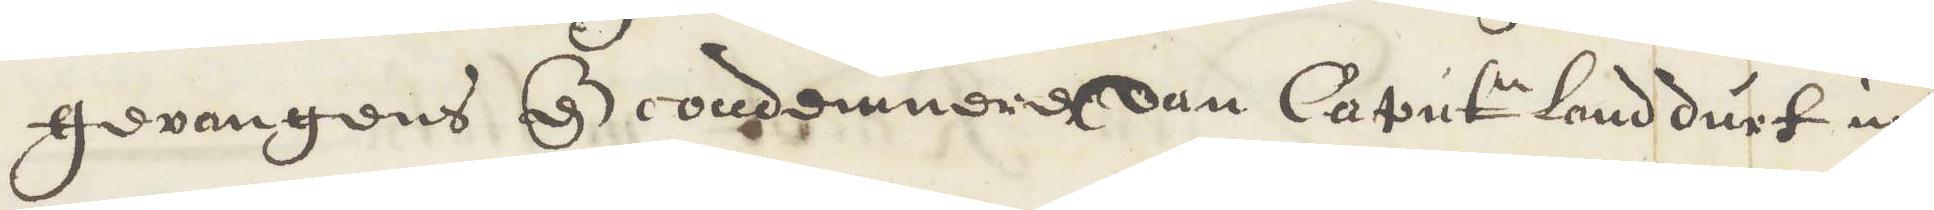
gevangens ende condemneren dan Caput-n landdurf in
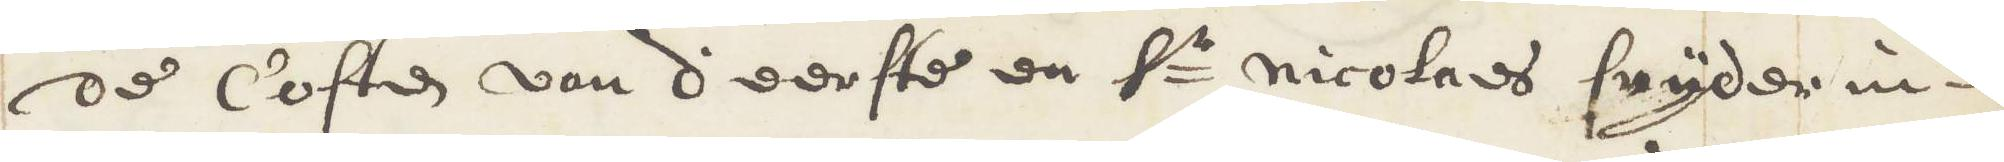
de costen van d’eerste en s=r nicolaes snijder in —
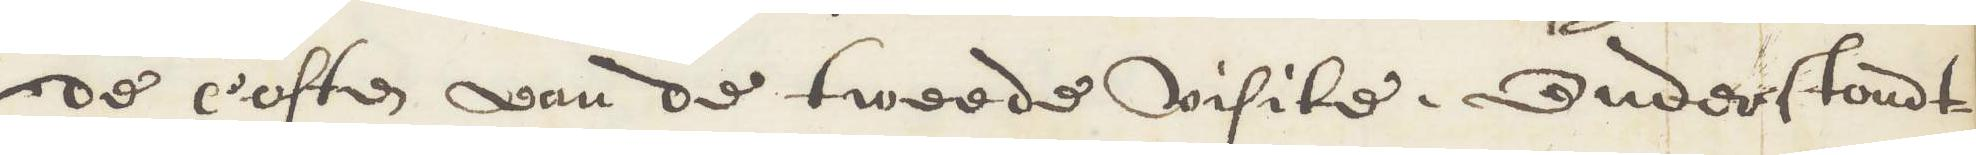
de costen van de tweede visite. Onderstondt
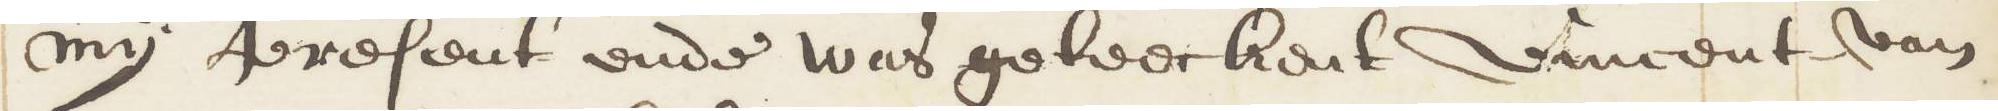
mij present ende was geteeckent vincent van
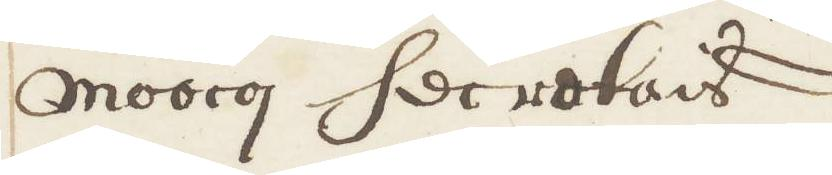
moocq secretaris
